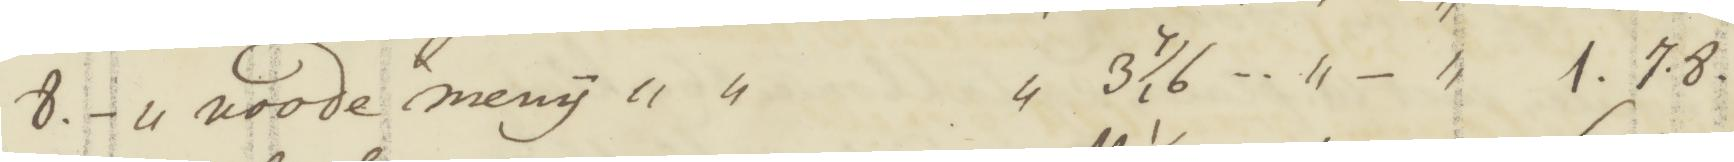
8. – „ roode menij „ „ „ 3 7/16 „ — „ 1. 7. 8
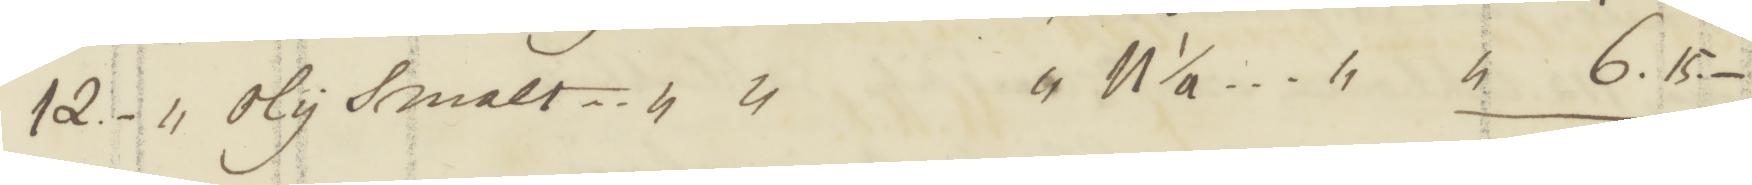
12. – „ olij smalt - - „ „ „ 11¼ - - - „ „ 6. 15.—
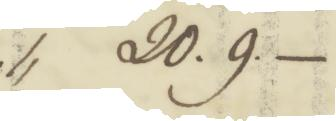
„ 20. 9. —
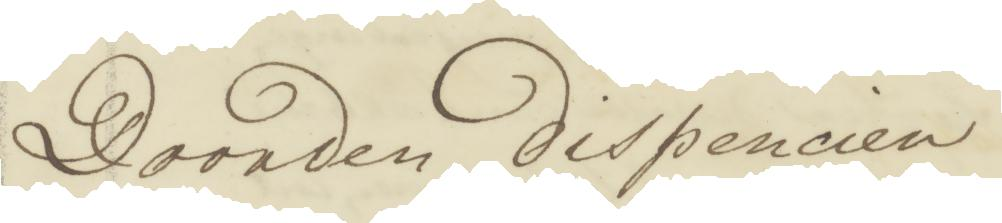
Doorden dispencier
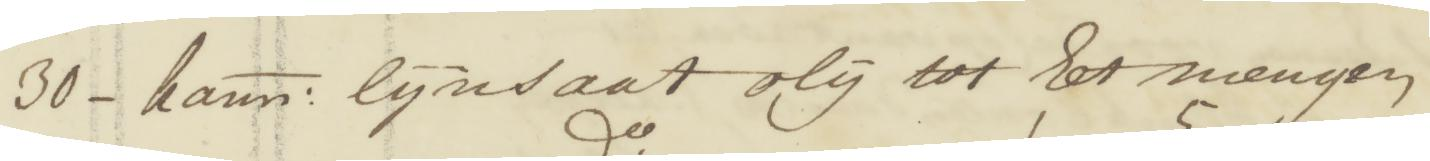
30 – kann: lijnsaat olij tot het mengen
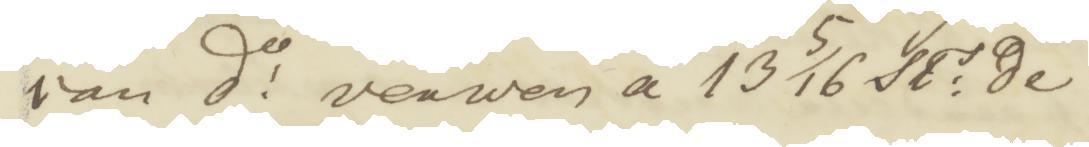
van d:o verwen á 13 5/16 st:s de
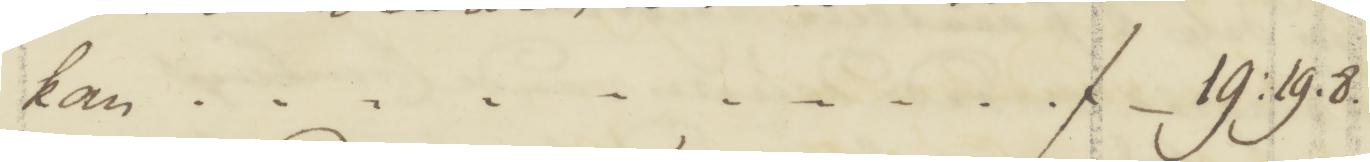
kan . . . . . . . . . . ƒ — 19: 19. 8
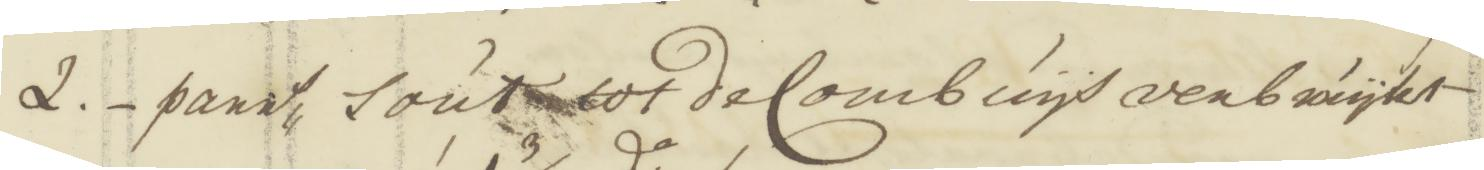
2. – parr„s sout tot de Combuijs verbruijkt
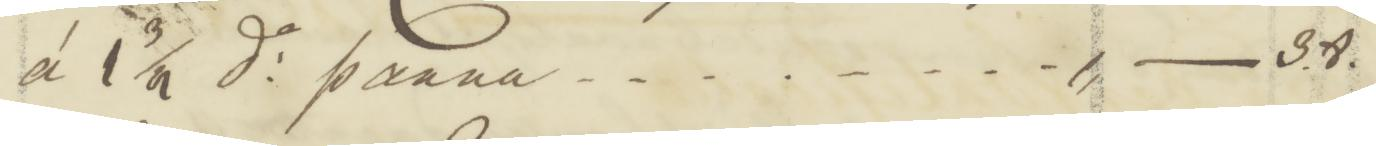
á 1¾ d:o parra - - - . - - - - „ — 3. 8.
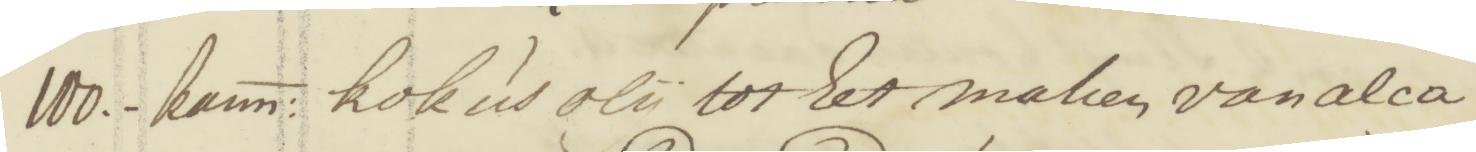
100. – kann: kokus olij tot het maken van alca
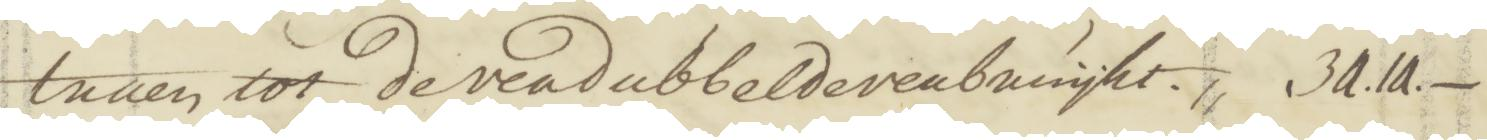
traen tot de verdubbelde verbruijkt . „ 34. 14.—
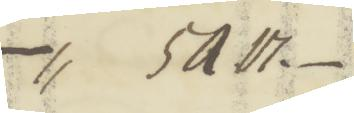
„ 54.17.—
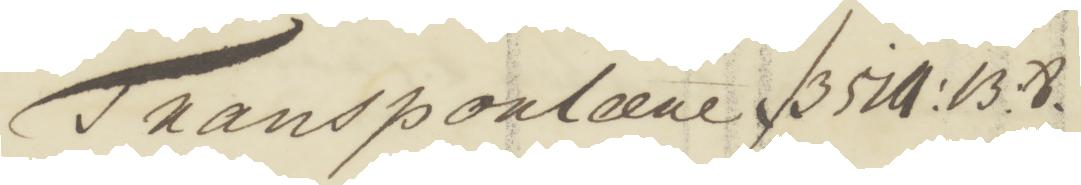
Transporteere ƒ3514: 13: 8.
